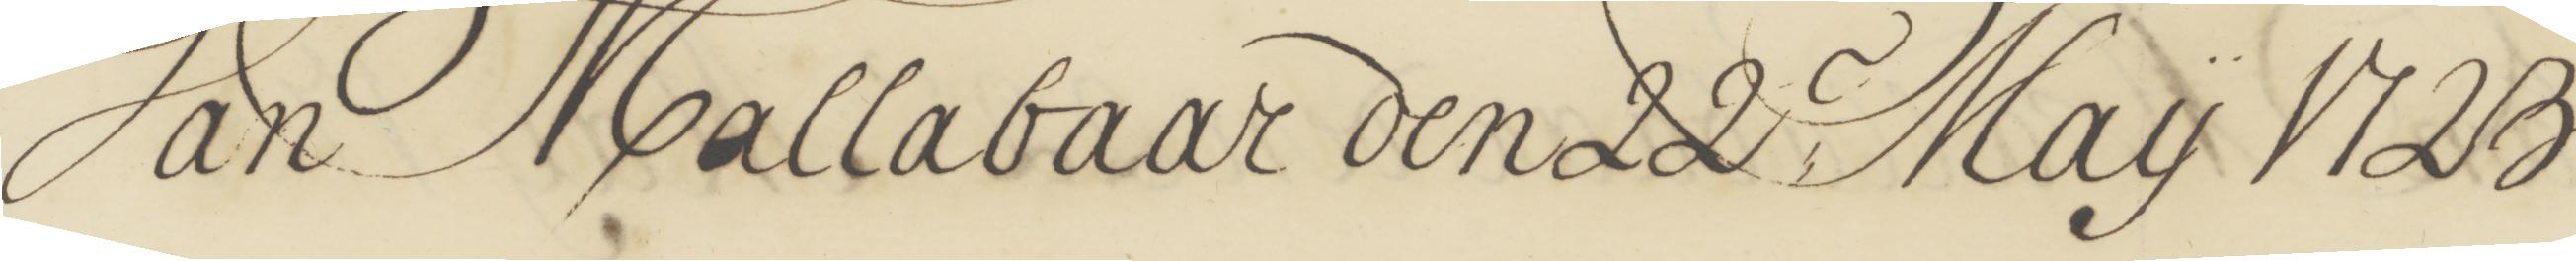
Van Mallabaar den 22„' Maij 1723
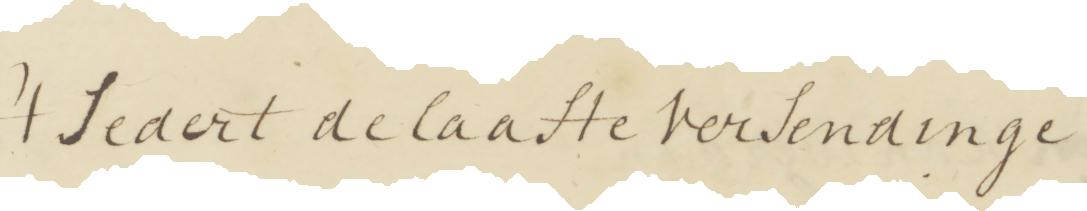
’t sedert de laaste versendinge
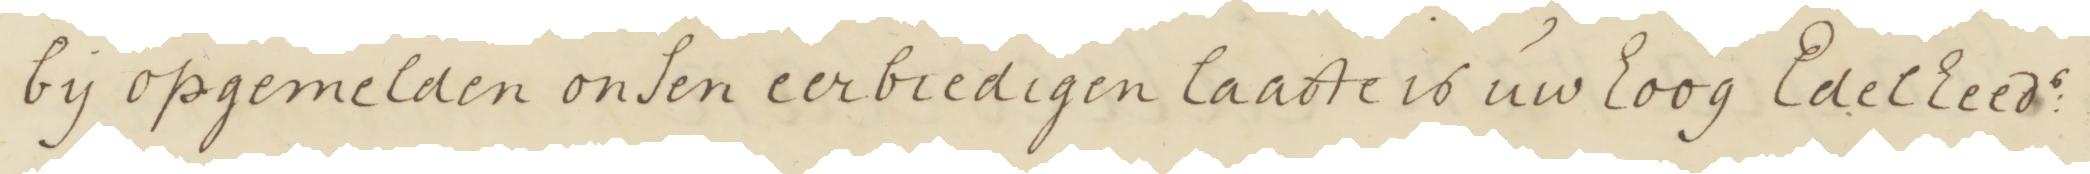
bij opgemelden onsen eerbiedigen laaste is uw hoog Edelheed:s
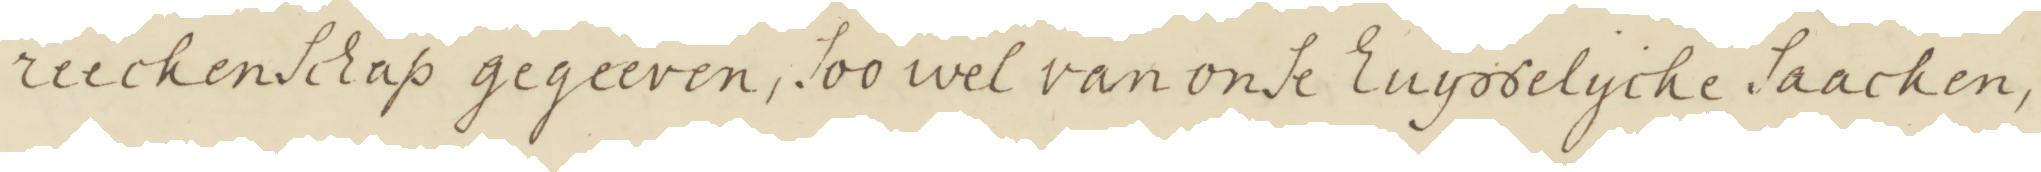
reeckenschap gegeeven, soo wel van onse huijsselijcke saacken,
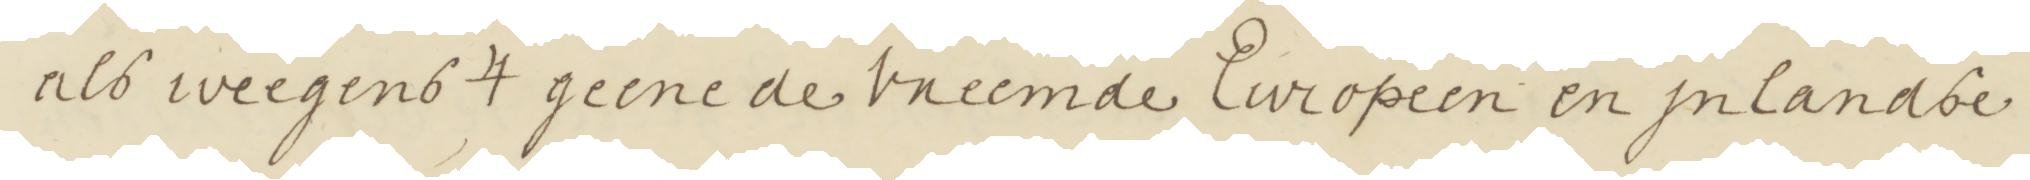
als weegens ’t geene de vreemde Europeen en jnlandse
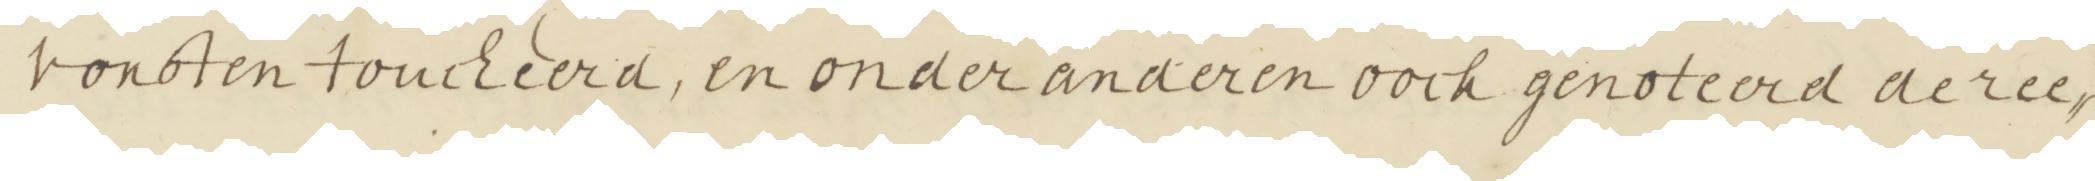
vorsten toucheerd, en onder anderen oock genoteerd de ree„
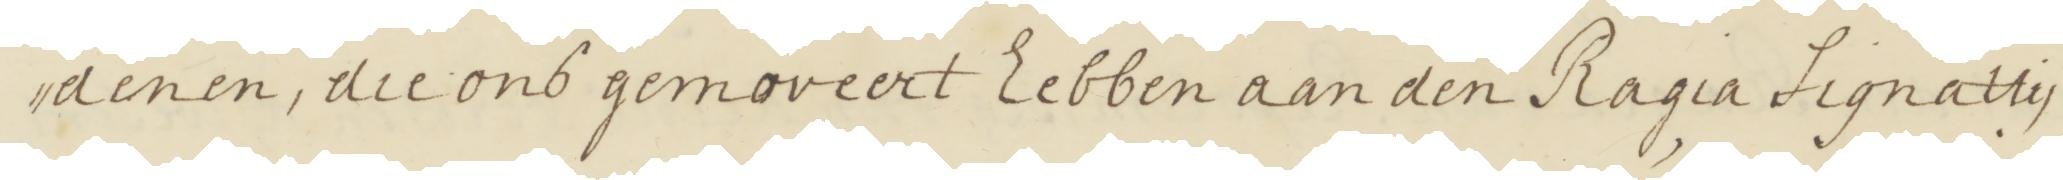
„denen, die ons gemoveert hebben aan den Ragia Signattij
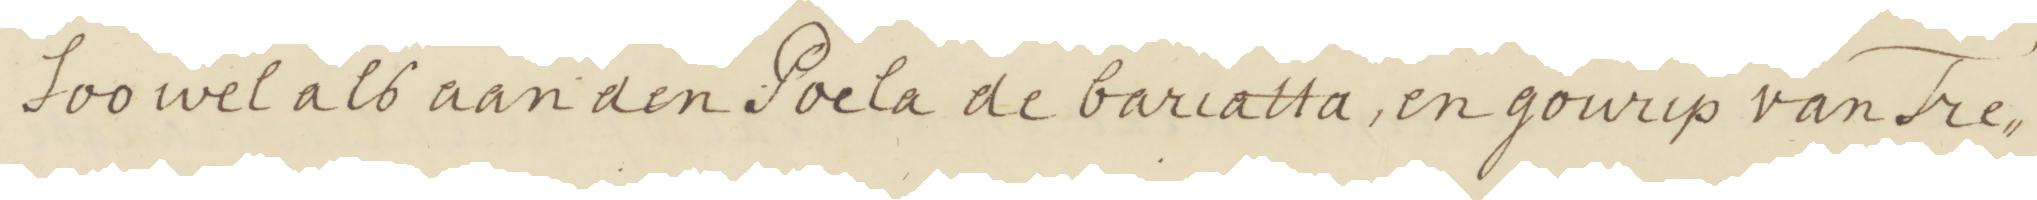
soo wel als aan den Poela de bariatta, en gourip van Tre„
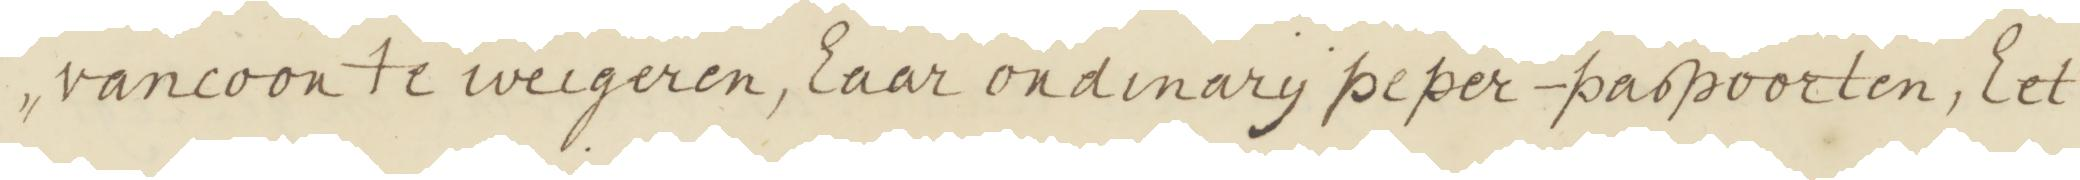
„vancoor te weigeren, haar ordinarij peper-paspoorten, het
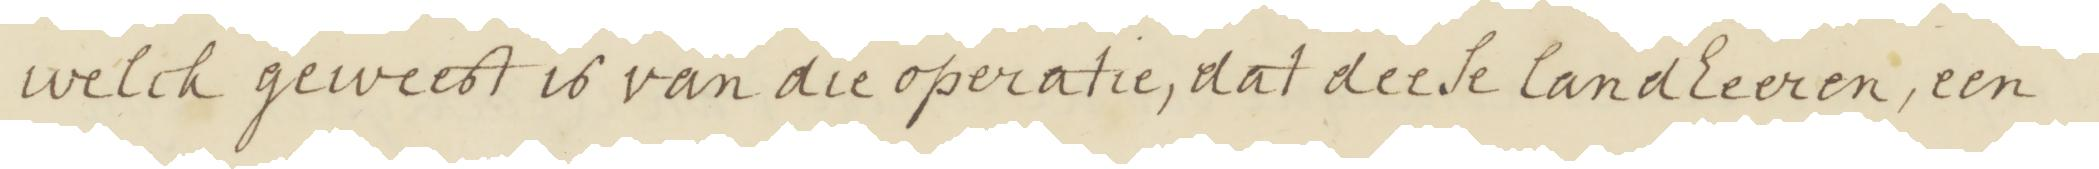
welck geweest is van die operatie, dat deese landheeren, een
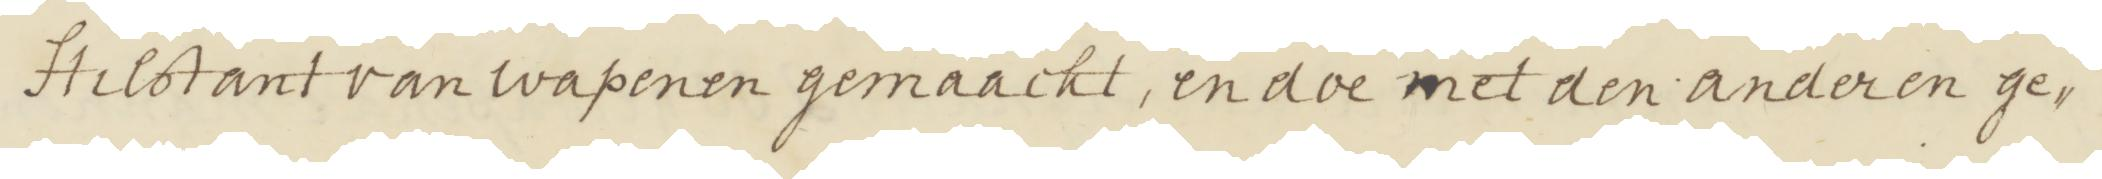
stilstant van wapenen gemaackt, en doe met den anderen ge„
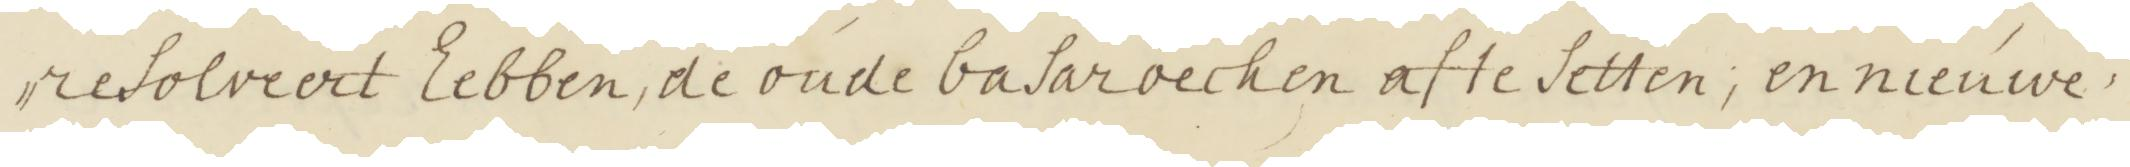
„resolveert hebben, de oude basaroecken afte setten; en nieuwe
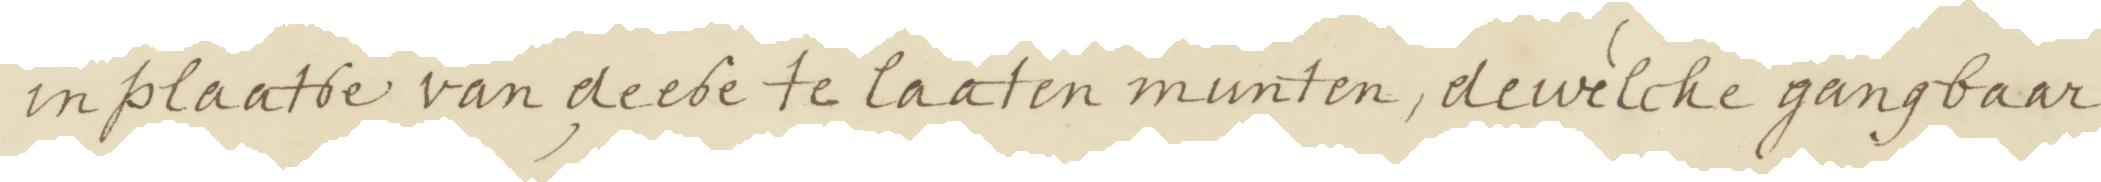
in plaatse van deese te laaten munten, dewelcke gangbaar
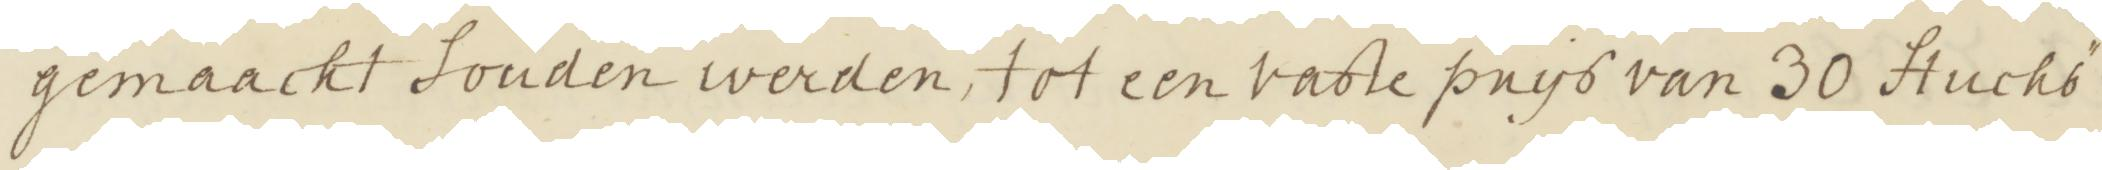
gemaackt souden werden, tot een vaste prijs van 30 stucks
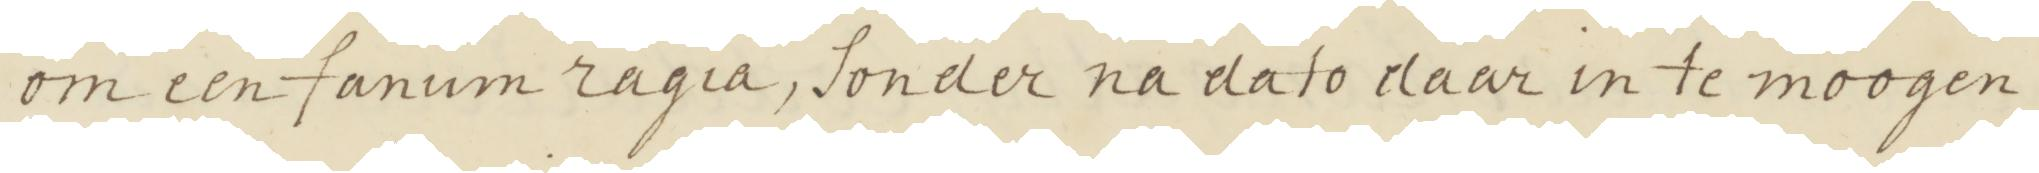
om een fanum ragia, sonder na dato daar in te moogen
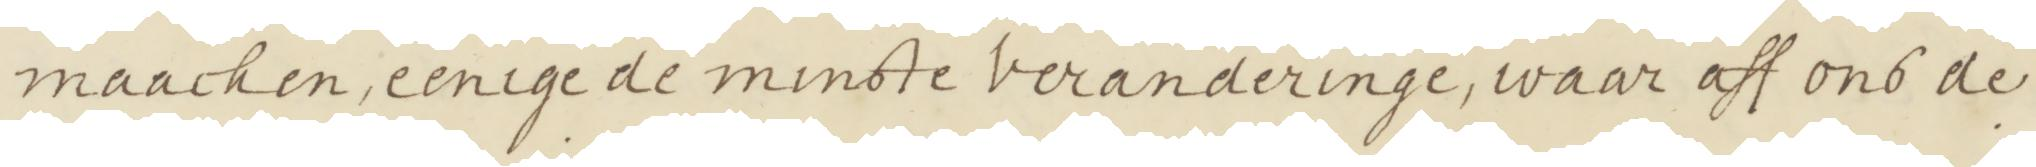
maacken, eenige de minste veranderinge, waar aff ons de
